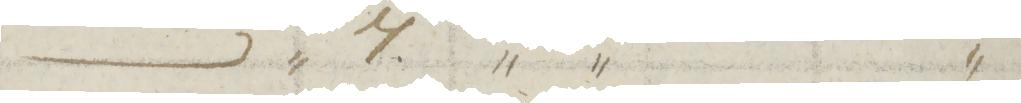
— „ 7. „ „ „
